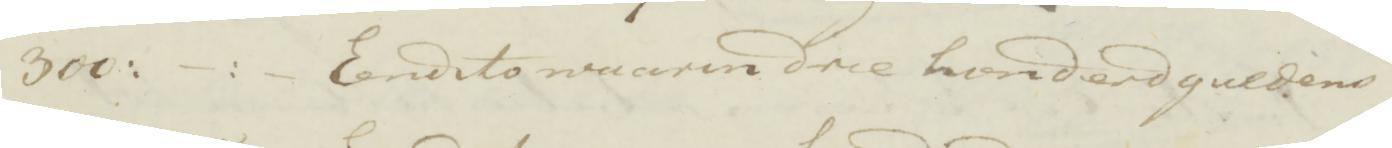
300: —: — Een dito waaren drie honderd guldens
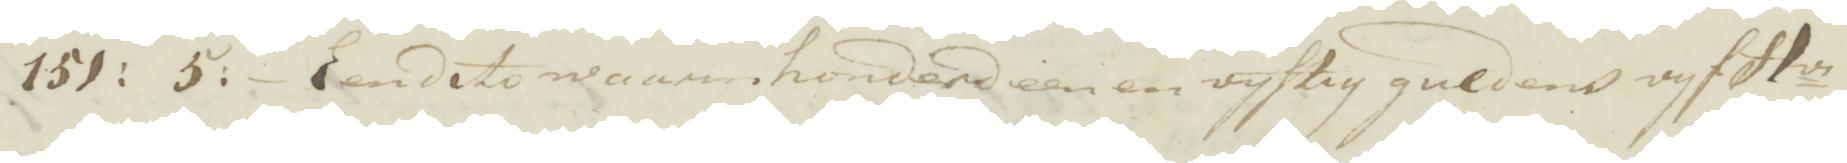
151: 5: — Een dito waaren honderd een en vijftig guldens vijf st=es
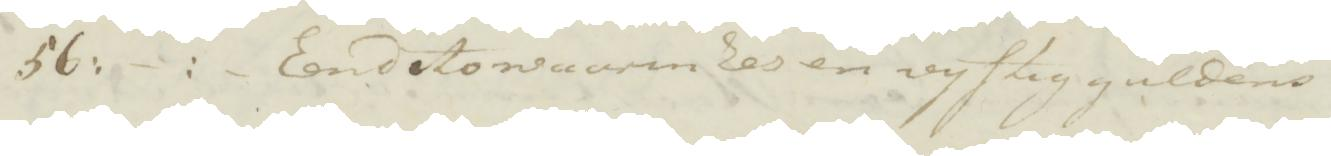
56: —: — Een dito waaren zes en vijftig guldens
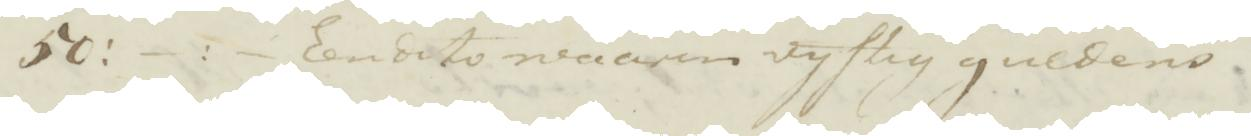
50: —: — Een dito waaren vijftig guldens
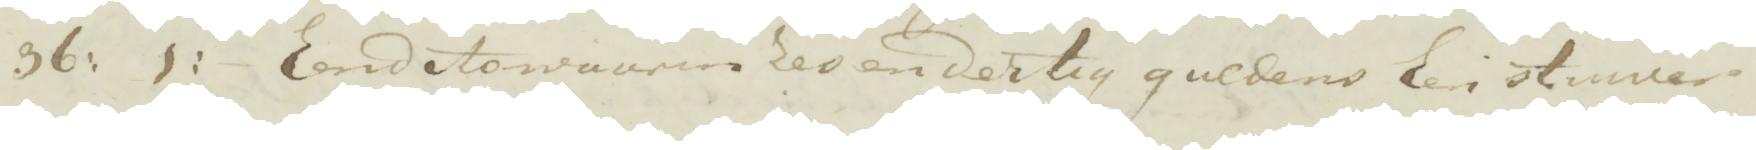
36: 1: — Een dito waaren zes en dertig guldens Een stuiver
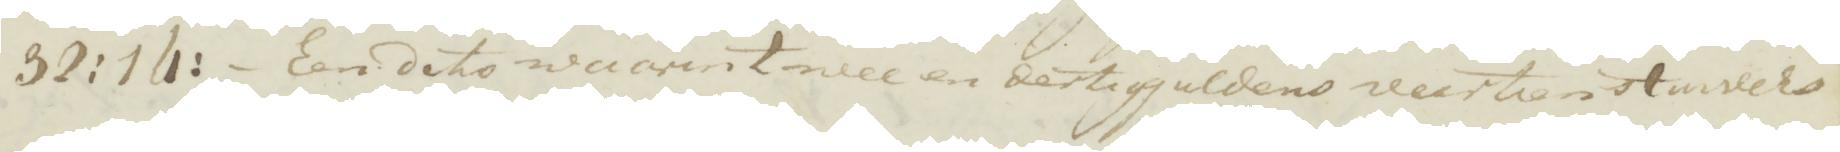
32:14: — Een dito waaren twee en dertig guldens veertien stuivers
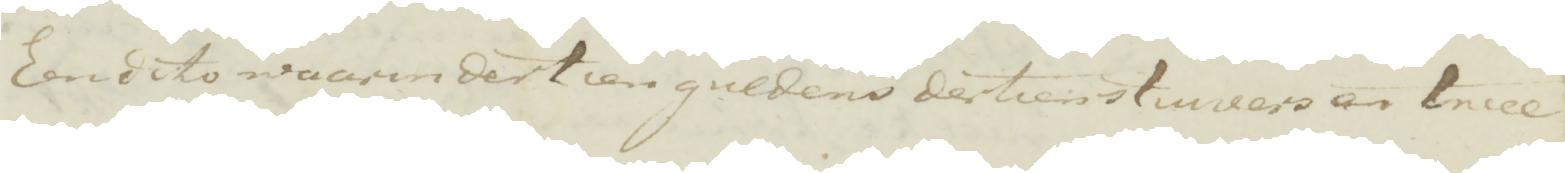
Een dito waaren dertien guldens dertien stuivers en twee
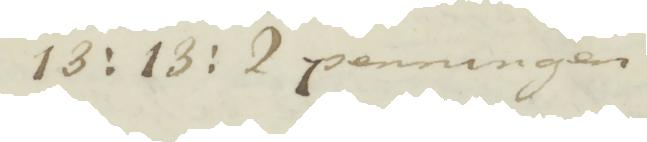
13:13: 2 penningen
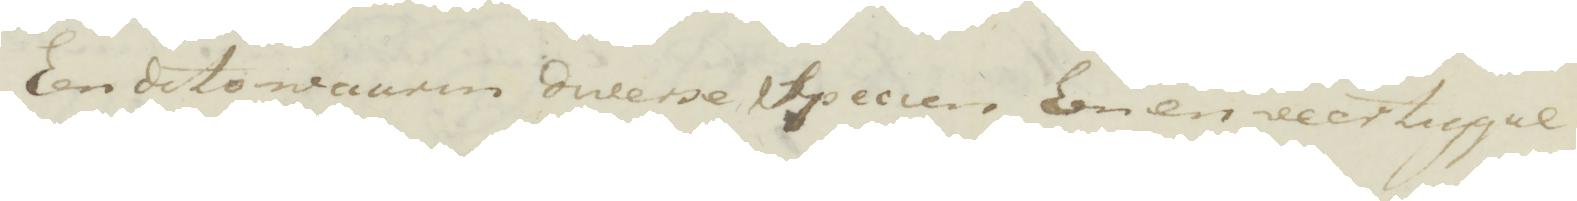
Een dito waaren diverse specien Een en veertiggul
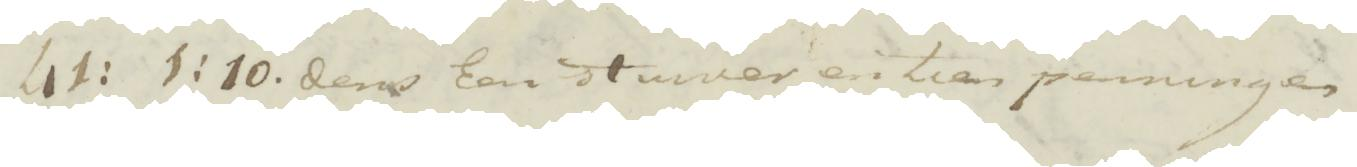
41: 1:10. dens Een stuiver en tien penningen
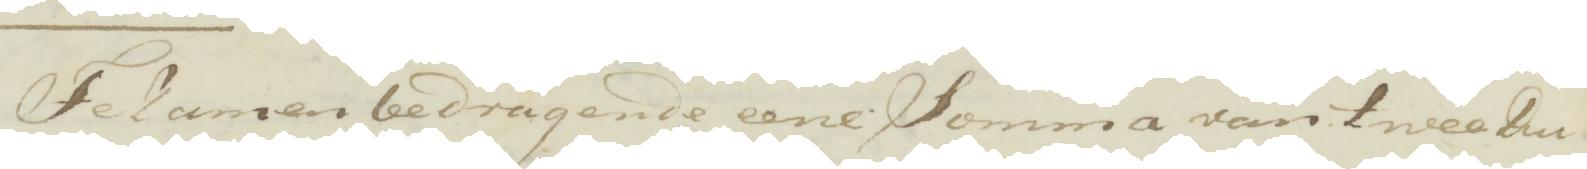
Tezamen bedragende eene somma van twee Dui
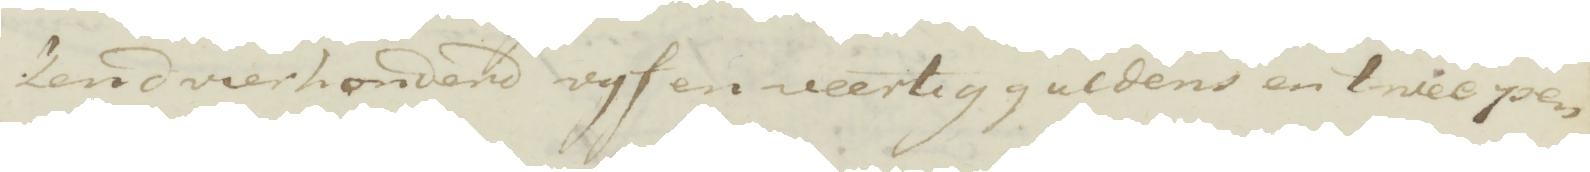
zendvierhonderd vijf en veertig guldens en twee pen
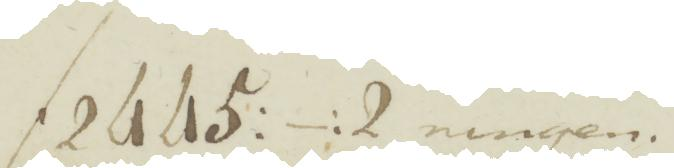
ƒ 2445: —: 2 ningen.
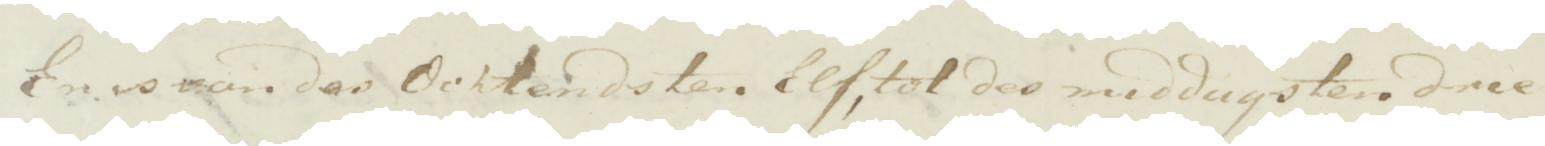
En is van des Ochtendsten Elf, tot des middagsten drie
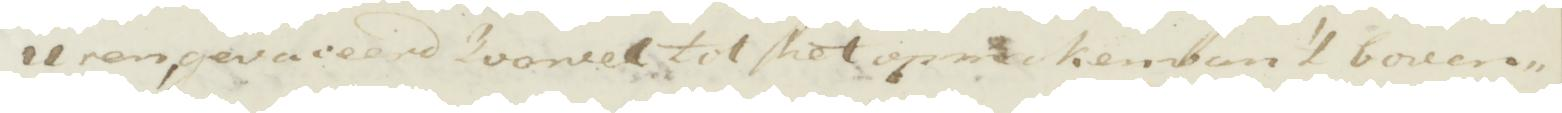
uren, gevaceerd zooveel tot het opmaken van ’t boven„
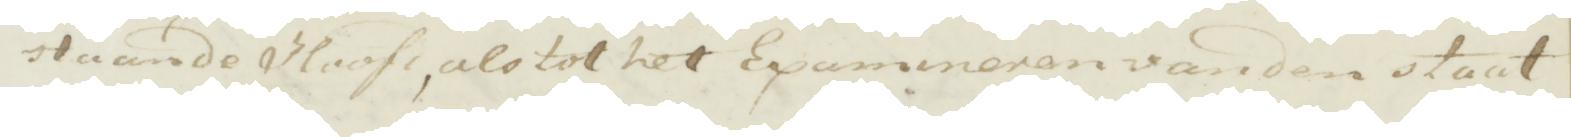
staande Hooft, als tot het Examineren van den staat
